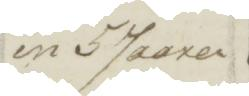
in 5 Jaaren
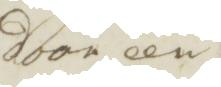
door een
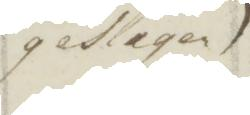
geslagen
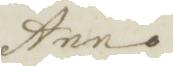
Anno
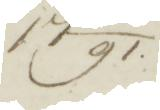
1790/91.
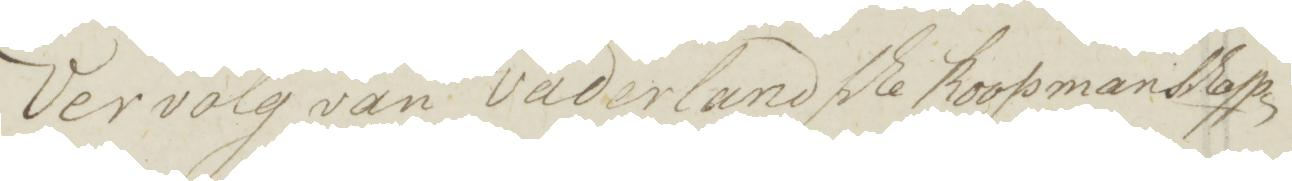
Vervolg van vaderlandsche koopmanschappen
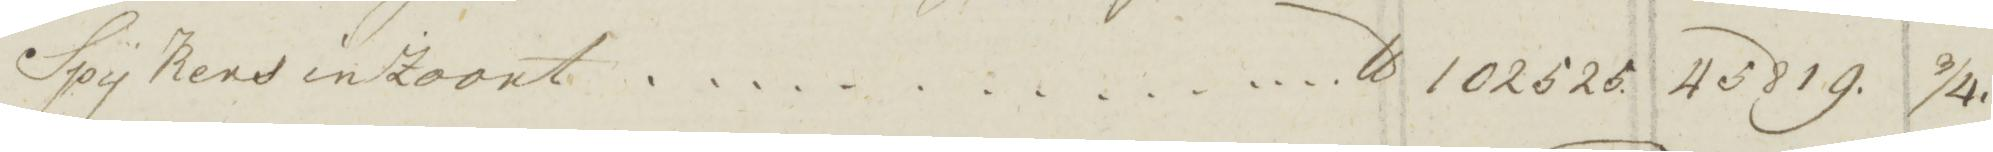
spijkers in zoort - - - - - - - - - - - - - - - lb 102525. 45819. ¾.
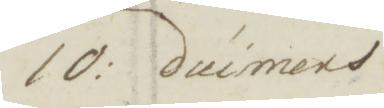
10: duimers
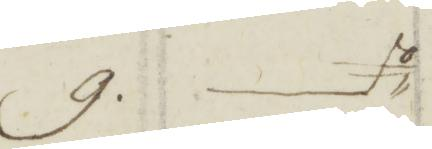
9. _„o
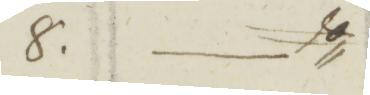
8: _„o
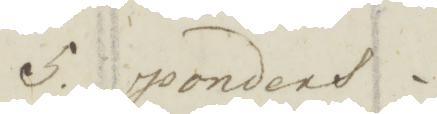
5. ponders
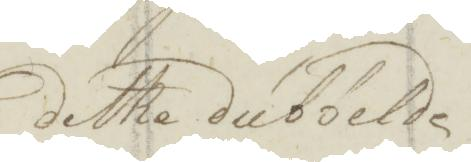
dikke dubbelde
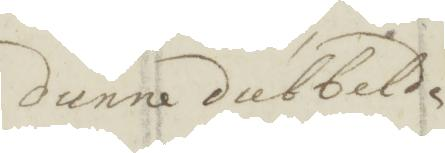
dunne dubbelde
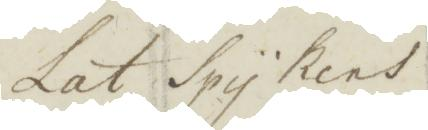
Lat spijkers
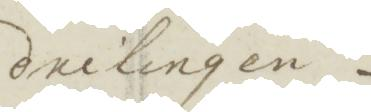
drilingen -
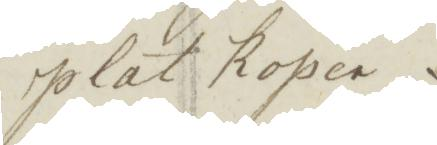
plat koper
